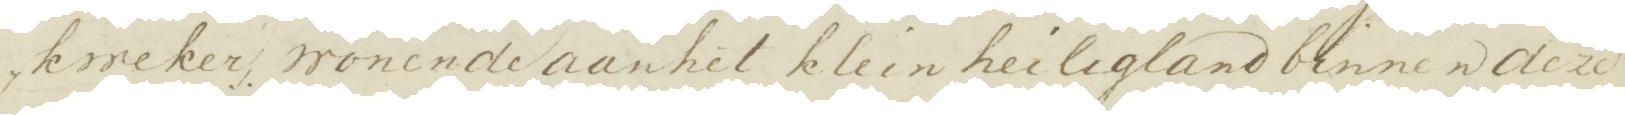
„kweker, wonende aan het klein heiligland binnen deze
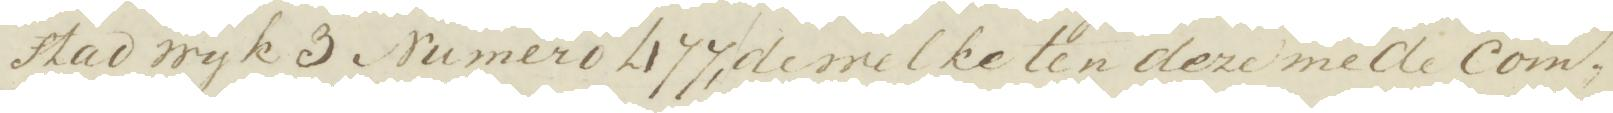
stad wijk 3 Numero 477, de welke ten deze mede Com„
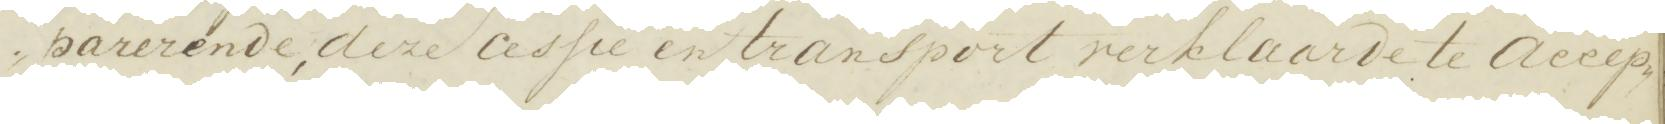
„parerende, deze cessie en transport verklaarde te Accep„
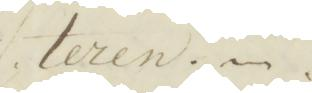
„teren.—
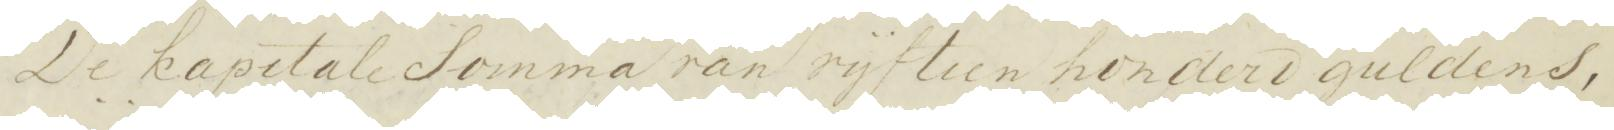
De kapitale Somma van vijftien honderd guldens,
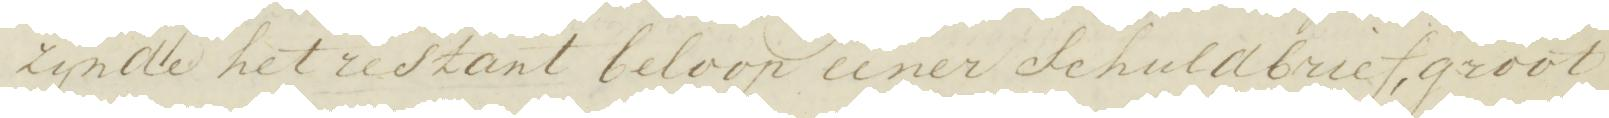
zijnde het restant beloop eener Schuldbrief, groot
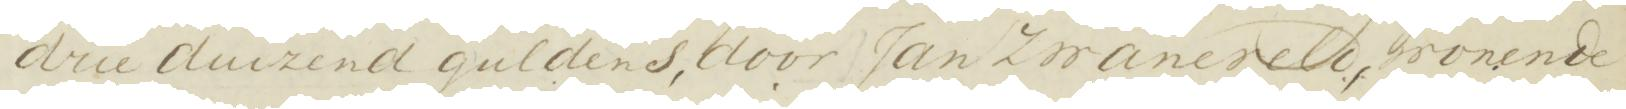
drie duizend guldens, door Jan Zwaneveld, wonende
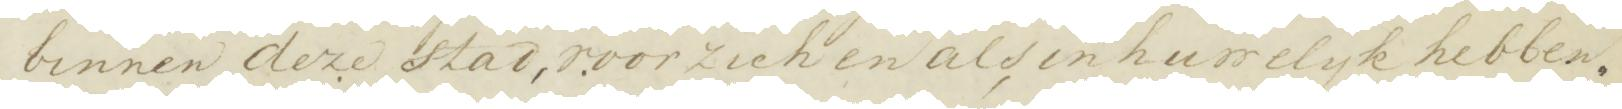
binnen deze stad, voor zich en als in huwelyk hebben„
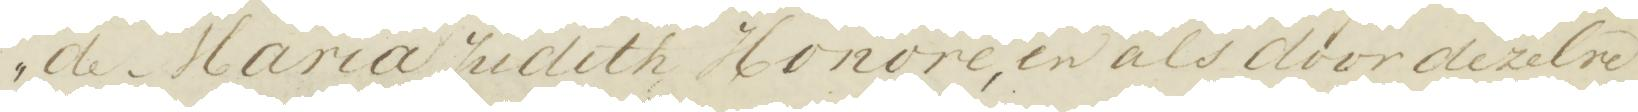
„de Maria Judith Honoré, en als door dezelve
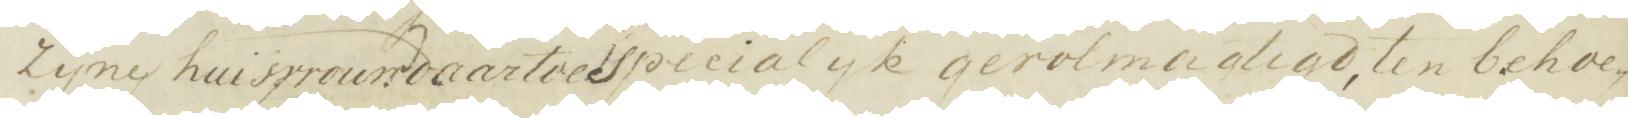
zijne huisvrouw daartoe specialijk gevolmagtigd, ten behoe„
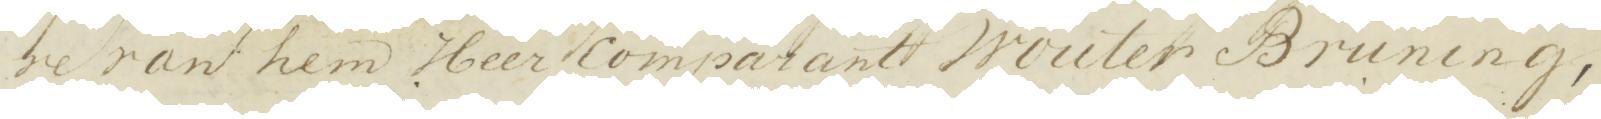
ve van hem Heer Comparant Wouter Bruning,
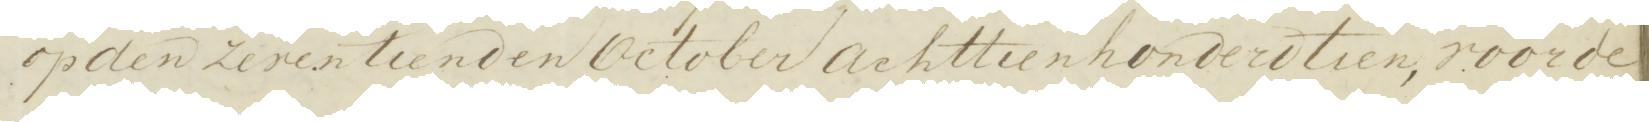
op den zeventienden October achttienhonderdtien, voor de
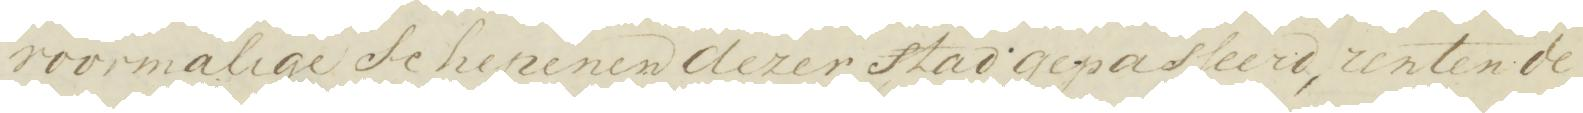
voormalige schepenen dezer stad gepasseerd, rentende
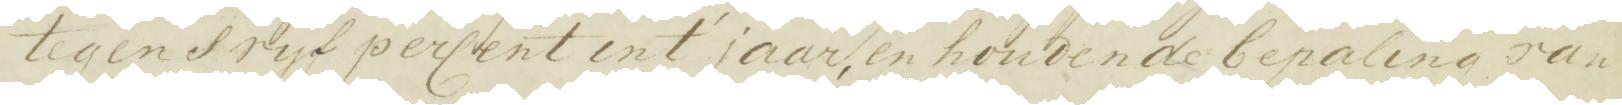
tegens vijf percent int'jaar, en houdende bepaling van
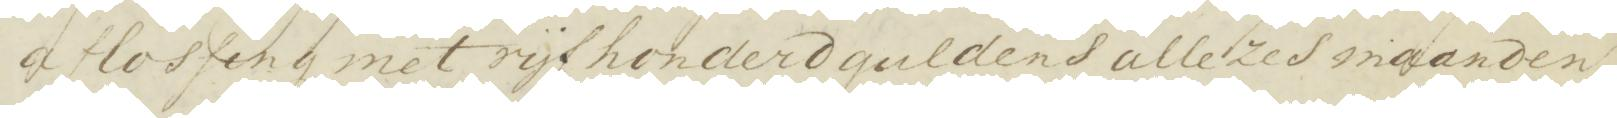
aflossing met vijf honderd guldens alle zes maanden
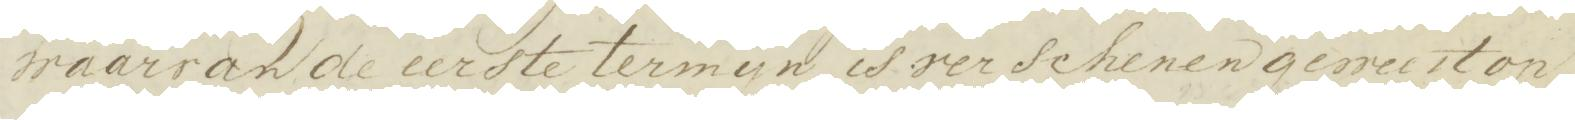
waarvan de eerste termijn is verschenen geweest op
